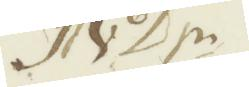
AV.Dj-r
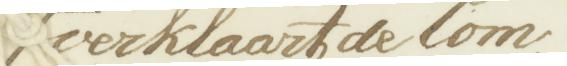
¶ verklaart de Com
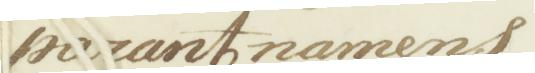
parant namens
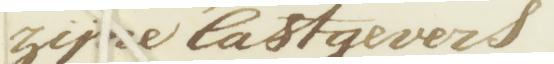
zijne lastgevers
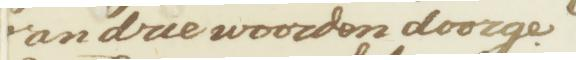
van drie woorden doorge.
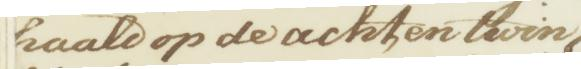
haald op de acht en twin„
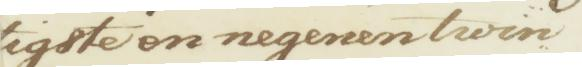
tigste en negenen twin„
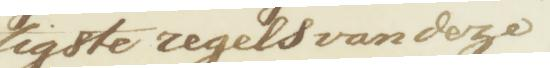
tigste regels van deze
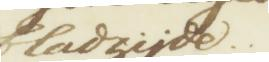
bladzijde..
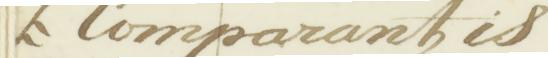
¶ Comparant is
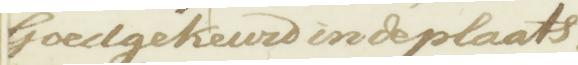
Goedgekeurd in de plaats:
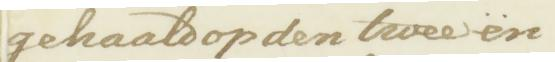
gehaald op den twee ën
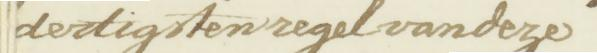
dertigsten regel van deze
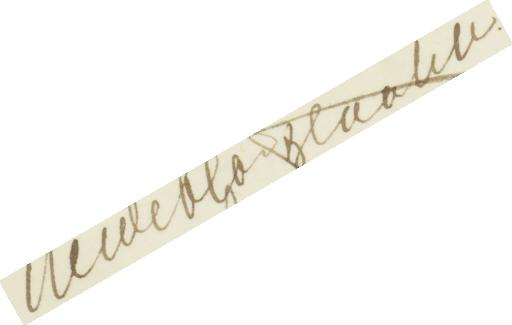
dubble Bladz.
